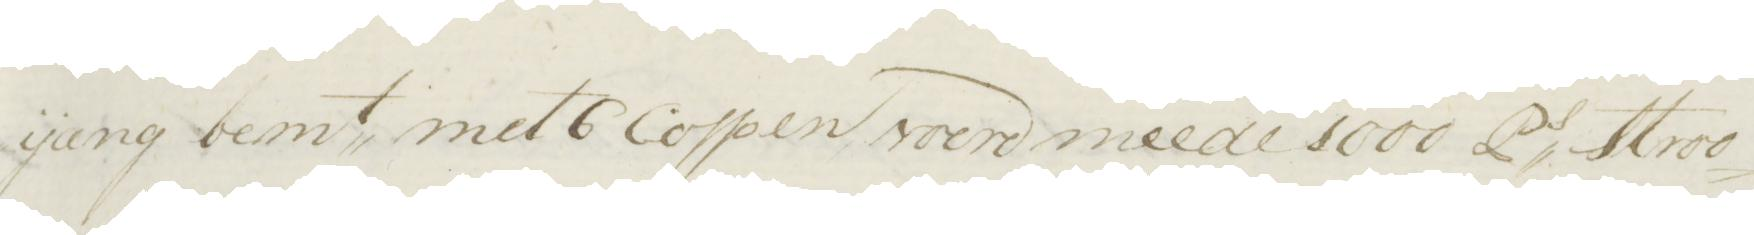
ijang bem„t met 6 Coppen voerd meede 1000 P„s stroo=
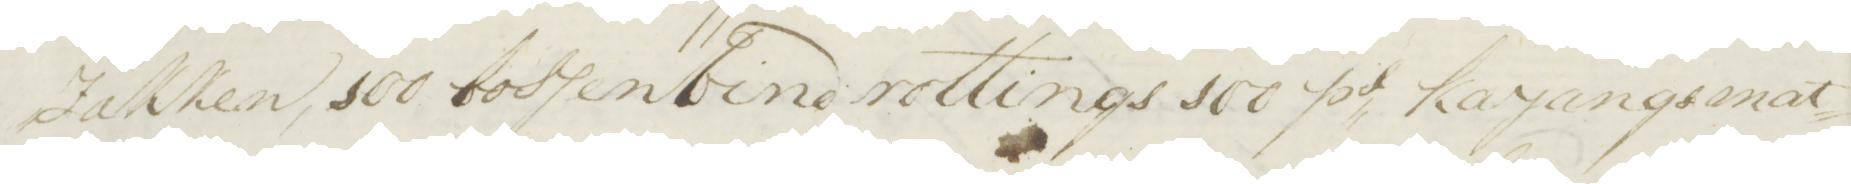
zakken, 100 bossen bind rottings 100 p„s kajangs mat=
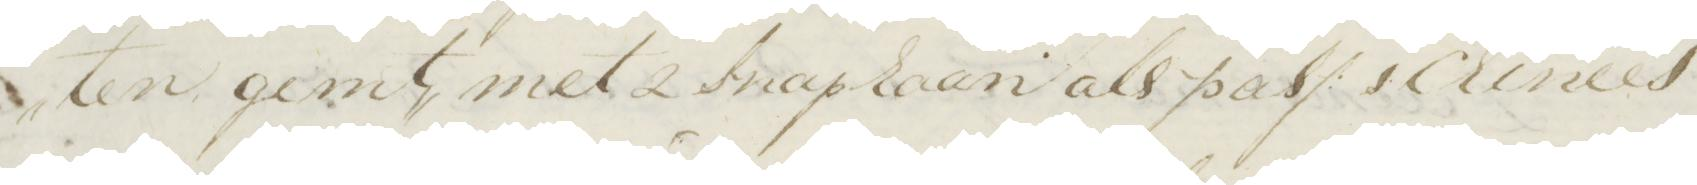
„ten gem„t met 2 snaphaan als pass: 1 Chinees
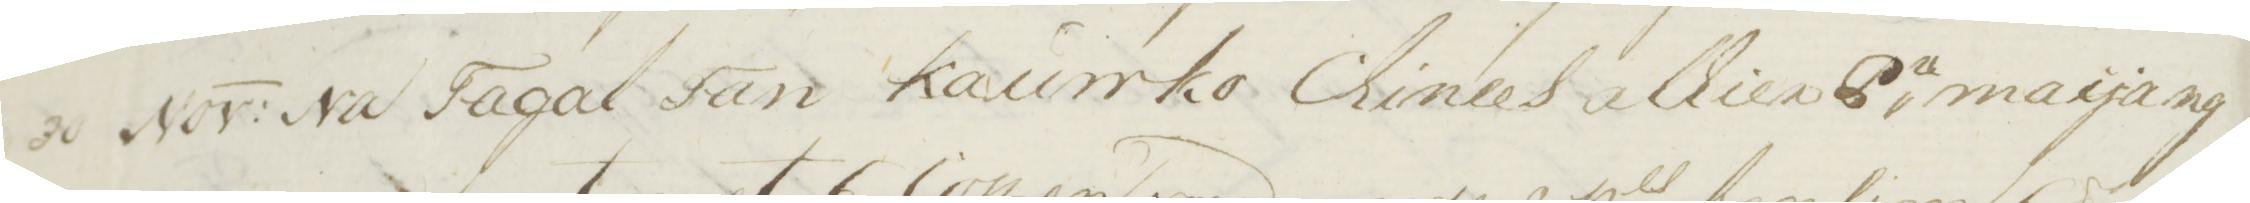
30 Nov: Na Tagal Tan kauwko Chinees alhier P„r maijang
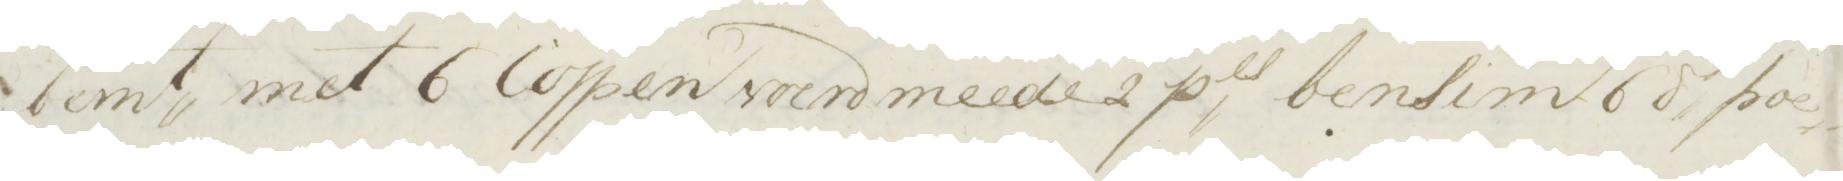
bem„t met 6 Coppen voerd meede 2 p„ls bensim 6 p„s poe=
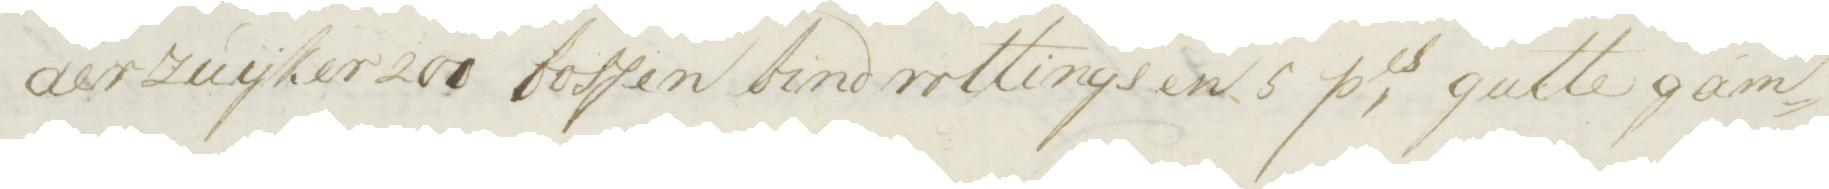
der zuijker 200 bossen bind rottings en 5 p„ls gutte gam=
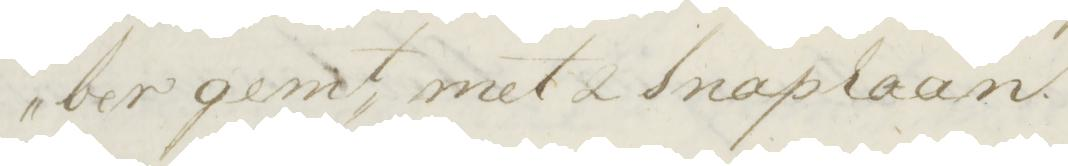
„ber gem„t met 2 snaphaan.
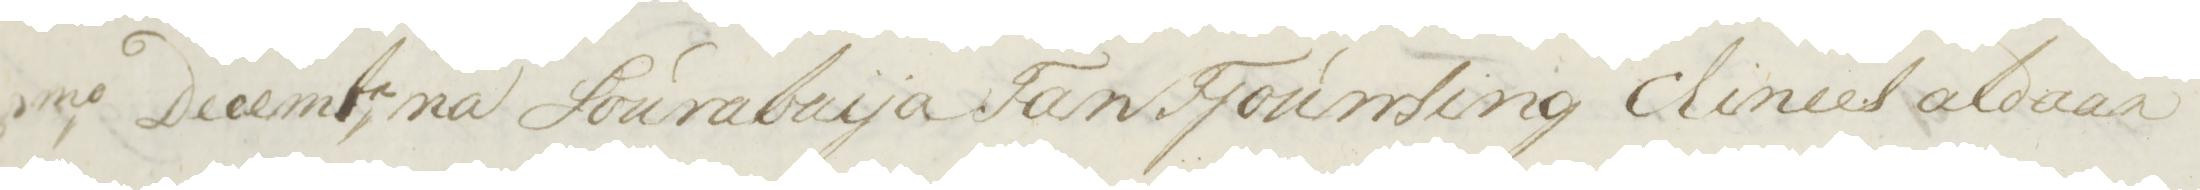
p„mo Decemb„r na Sourabaija Tan Tjouwsing Chinees aldaar
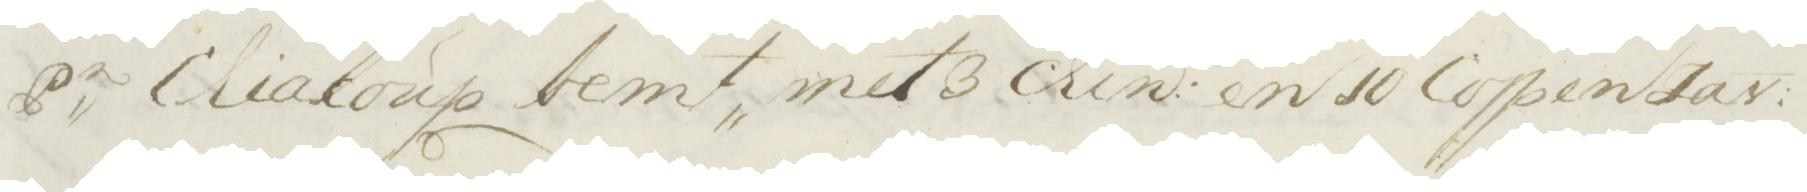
P„r Chialoup bem„t met 3 Chin: en 10 Coppen Jav:
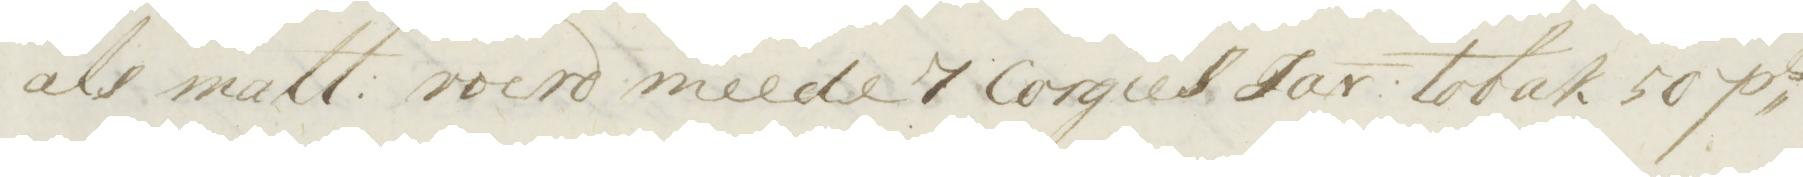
als matt: voerd meede 7 Corgies Jav: tobak 50 p„s
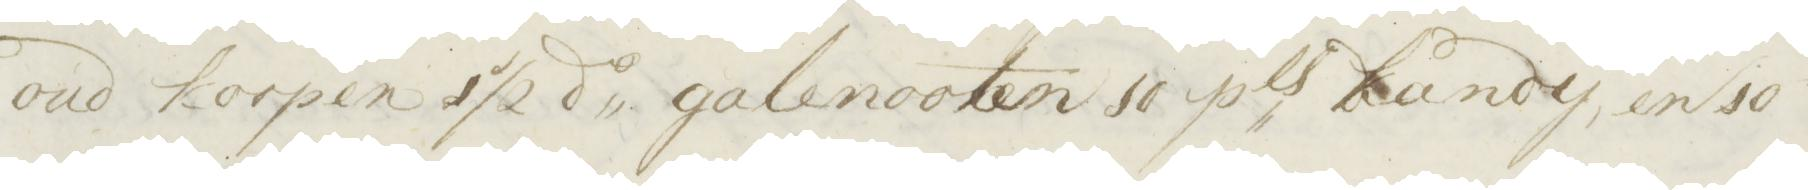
oud kooper 1½ d„o galenooten 10 p=ls kandij, en 10
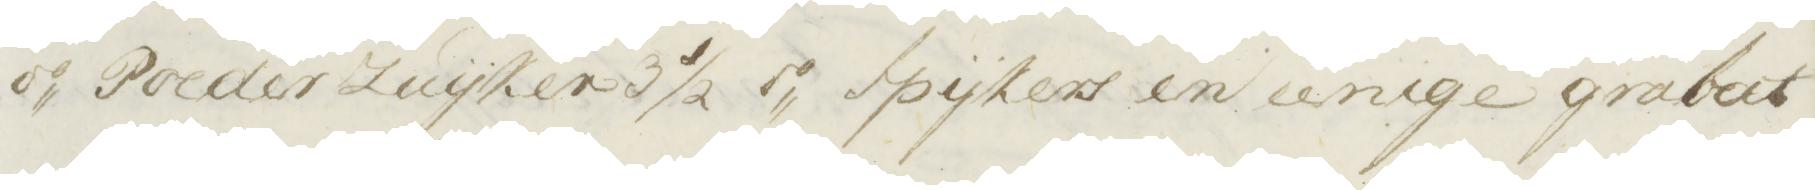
d„o Poeder zuijker 3½ p„s spijkers en eenige grabat
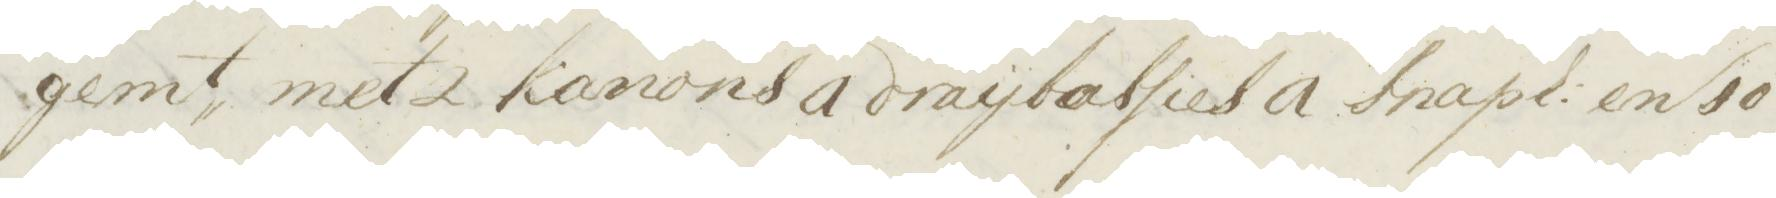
gem„t met 2 kanons 4 draijbassies 4 snaph: en 10
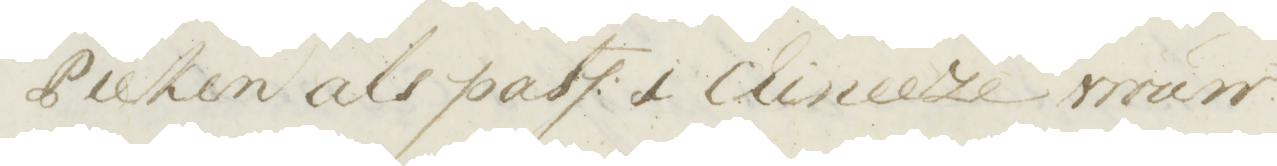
Pieken als pass: 1 Chineeze vrouw
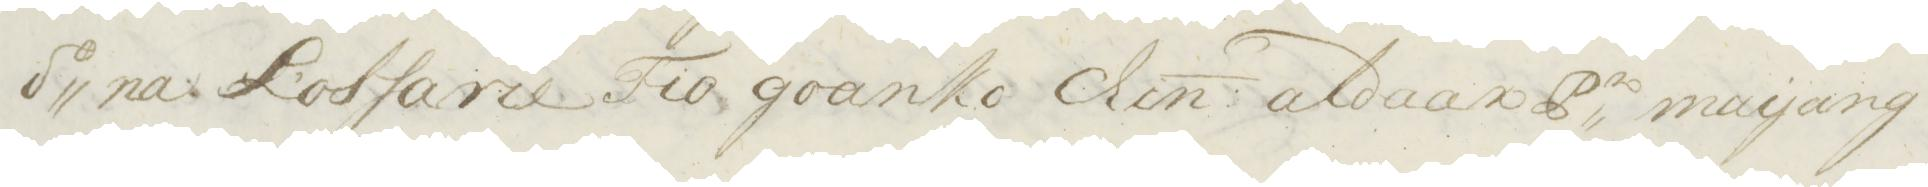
d„o na Lossarie Tio goanko Chin: aldaar P„r maijang
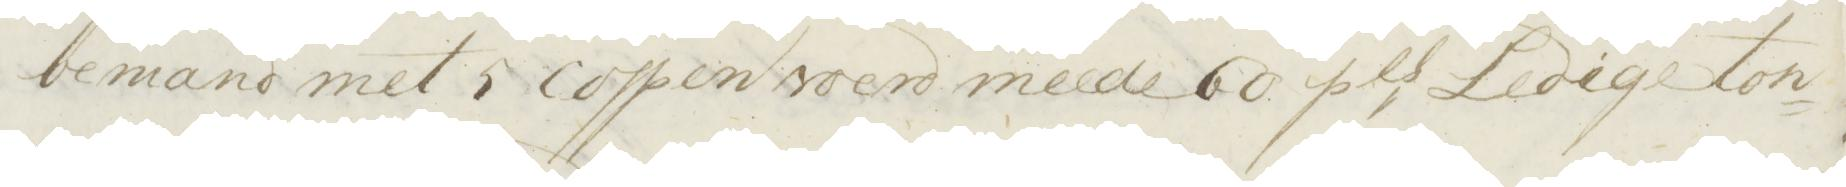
bemand met 5 coppen voerd meede 60 p„ls Ledige ton=
